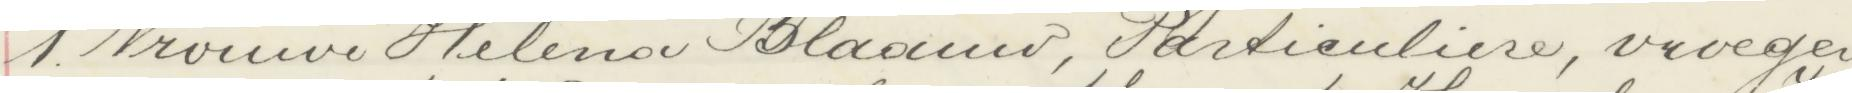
1. Vrouwe Helena Blaauw, Particuliere, vroegen
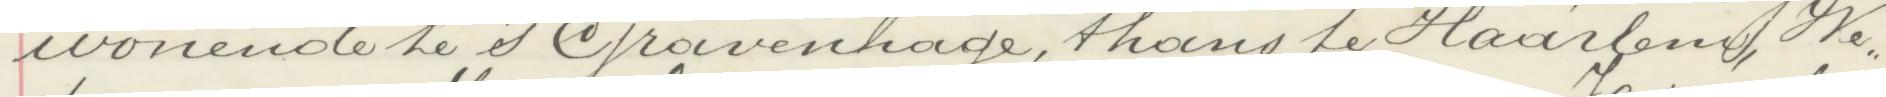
wonende te 's Gravenhage, thans te Haarlem, We„
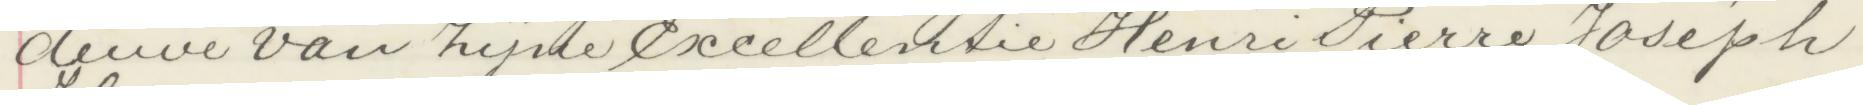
duwe van zijne Excellentie Henri Pierre Joseph
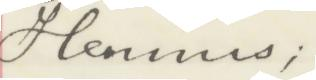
Hennus;
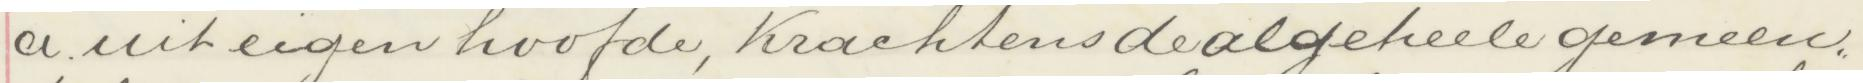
a. uit eigen hoofde, krachtens de algeheele gemeen„
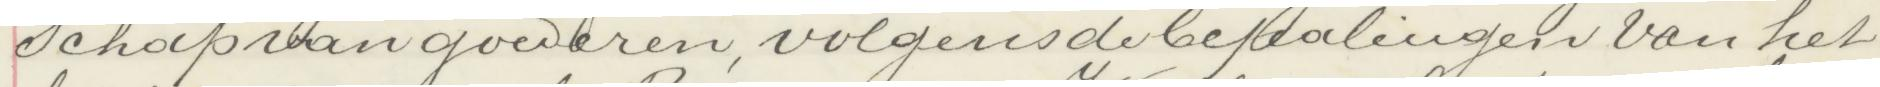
schap van goederen, volgens de bepalingen van het
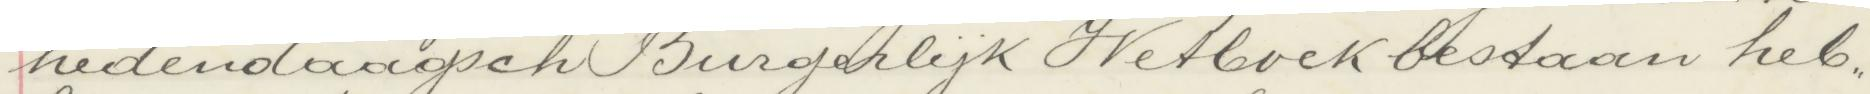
hedendaagsch Burgerlijk Wetboek bestaan heb„
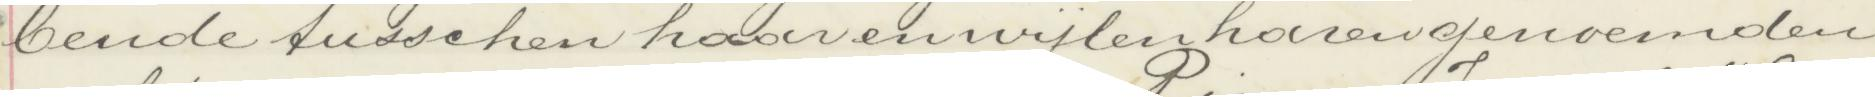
bende tusschen haar en wijlen haren genoemden
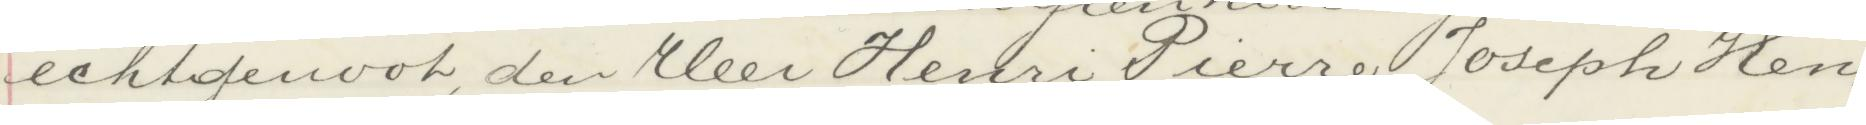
echtgenoot, den Heer Henri Pierre Joseph Hen
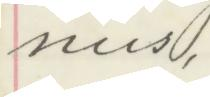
nus,
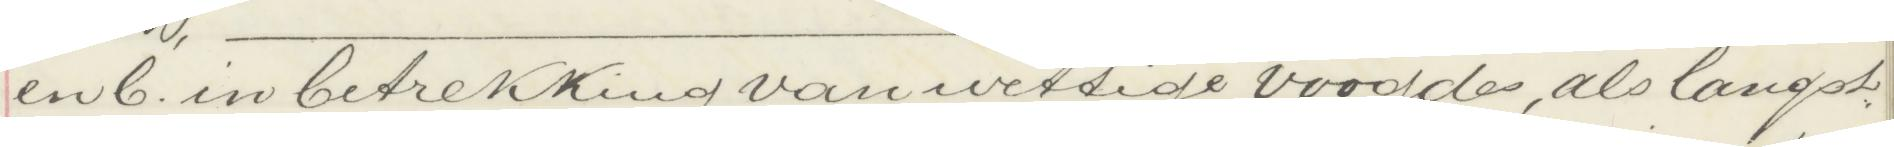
en b. in betrekking van wettige voogde, als langst„
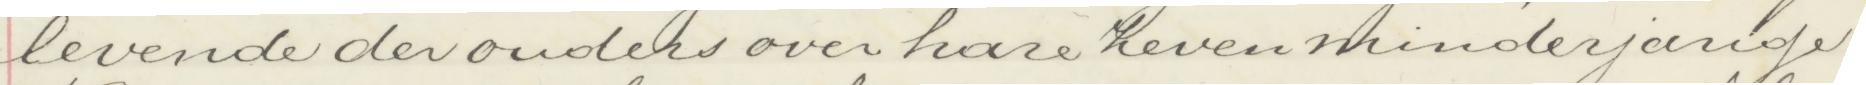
levende der ouders over hare zeven minderjarige
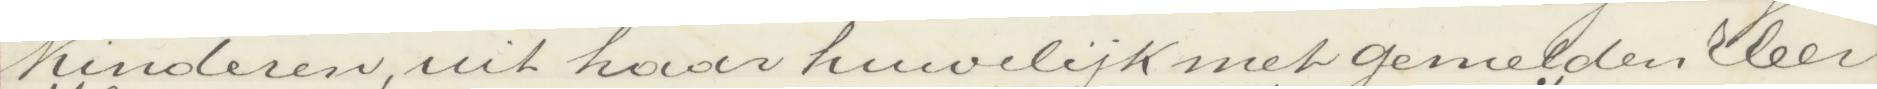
kinderen, uit haar huwelijk met gemelden Heer
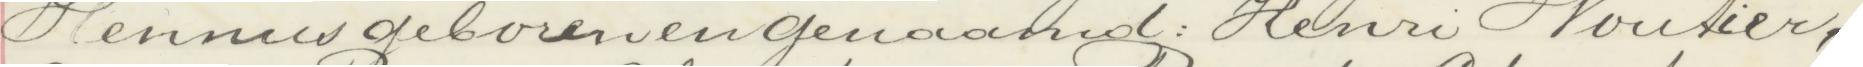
Hennus geboren en genaamd: Henri Woutier –
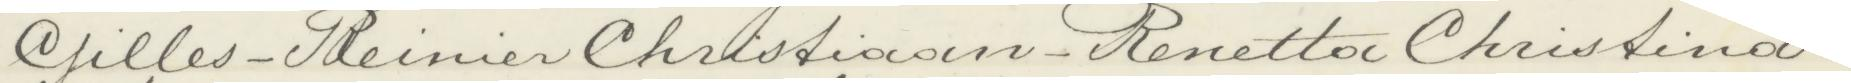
Gilles – Reinier Christiaan – Renetta Christina –
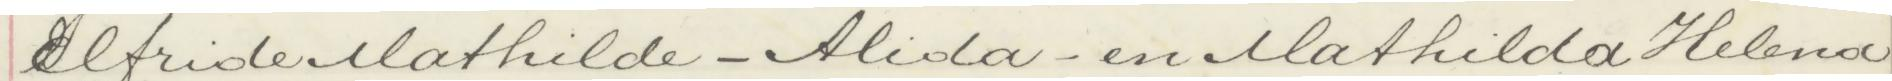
Elfride Mathilde – Alida – en Mathilda Helena
